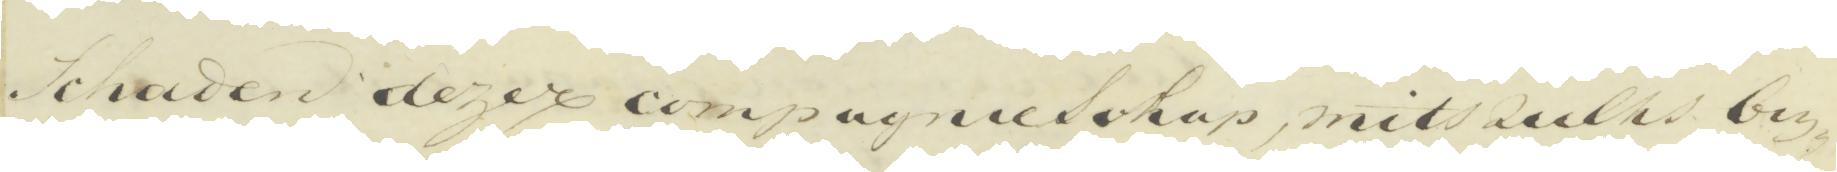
schaden dezer compagnieschap, mits zulks bin„
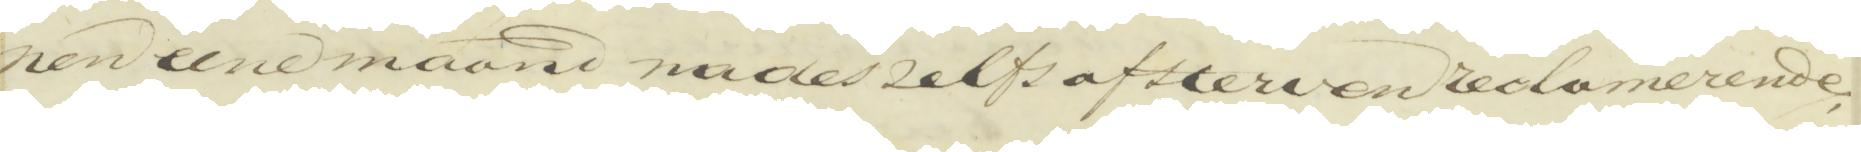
nen eene maand na deszelfs afsterven reclamerende,
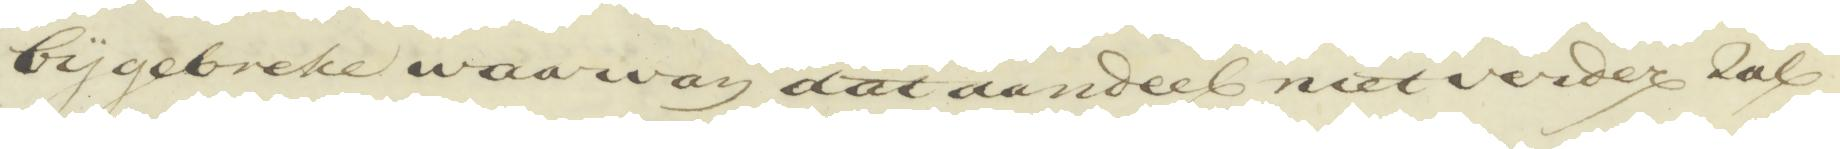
bij gebreke waarvan dat aandeel niet verder zal
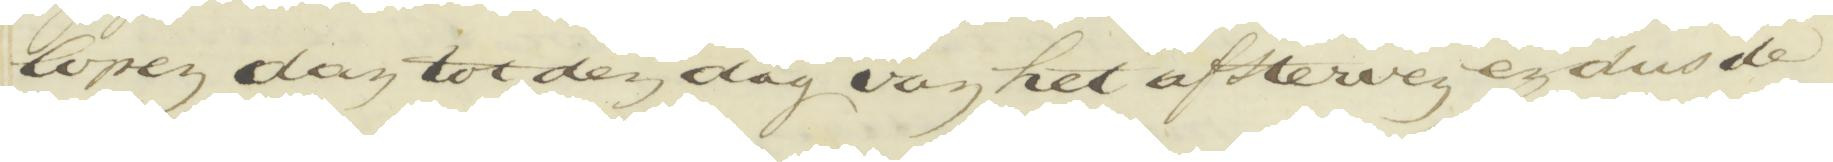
lopen dan tot den dag van het afsterven en dus de
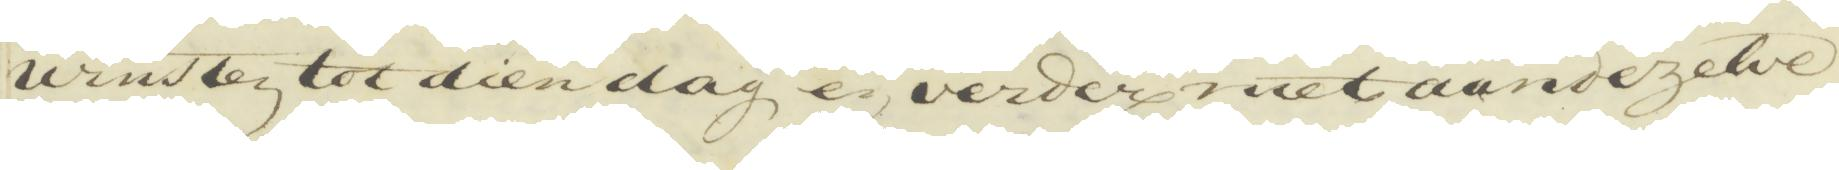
winsten tot dien dag en verder niet aan dezelve
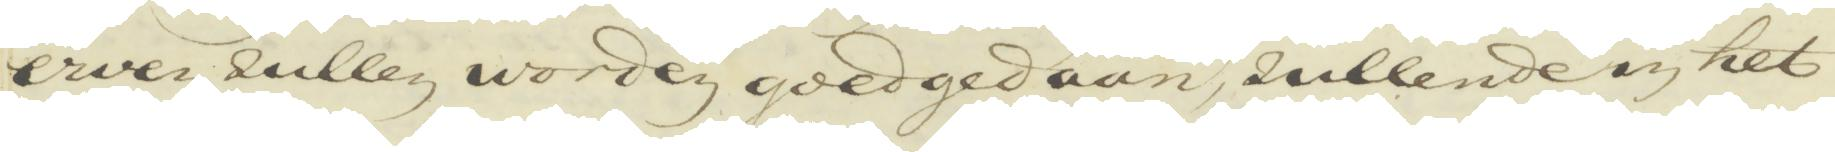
erven zullen worden goedgedaan, zullende in het
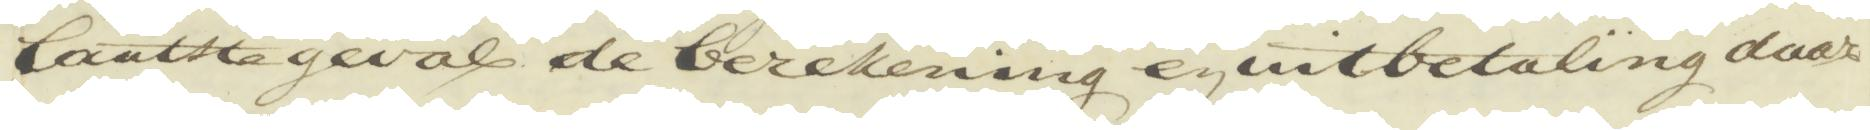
laatste geval de berekening en uitbetaling daar
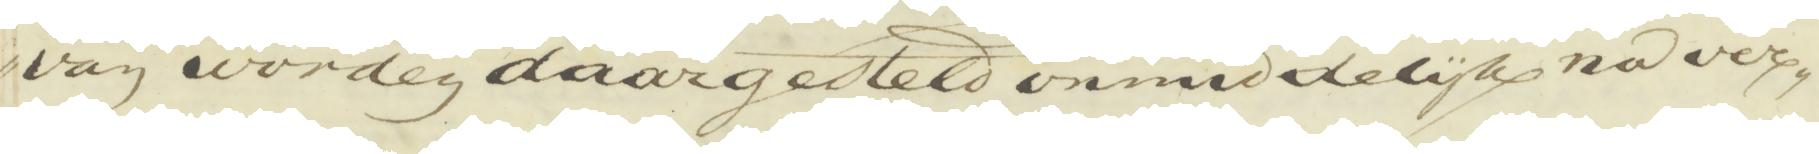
„van worden daargesteld onmiddelijk na ver„
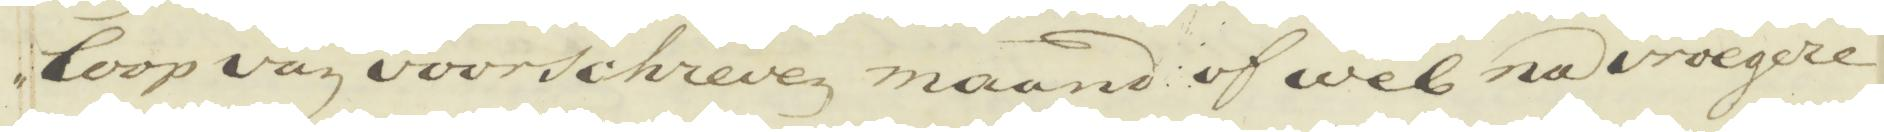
„loop van voorschreven maand of wel na vroegere
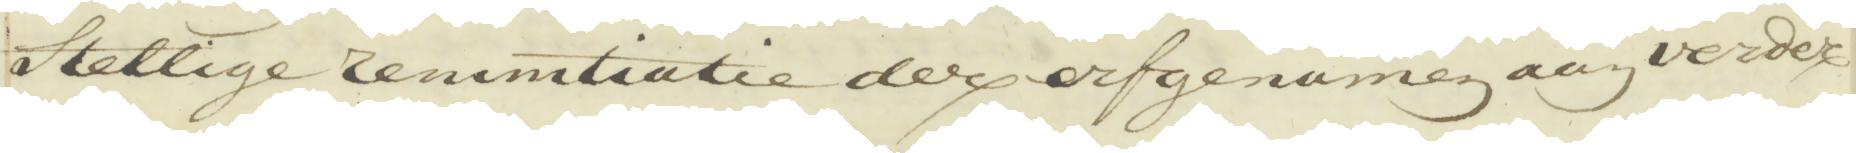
stellige renuntiatie der erfgenamen aan verder
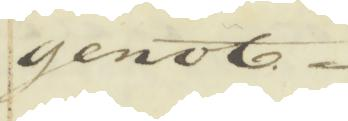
genot. —
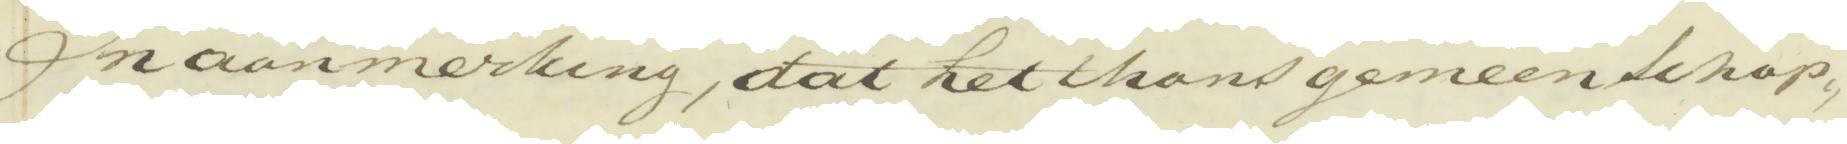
In aanmerking, dat het thans gemeenschap„
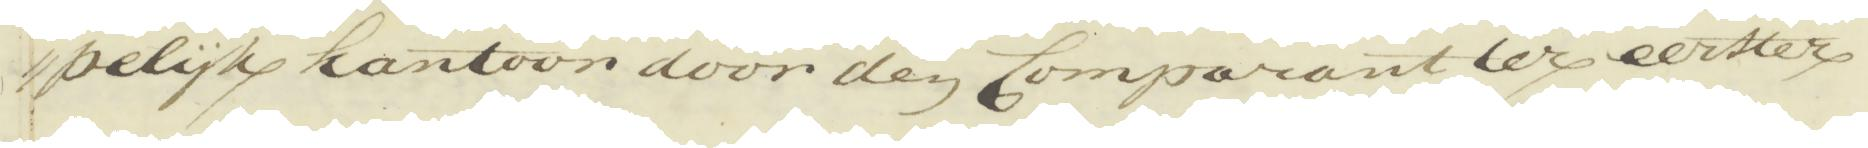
„pelijk kantoor door den Comparant ter eerster
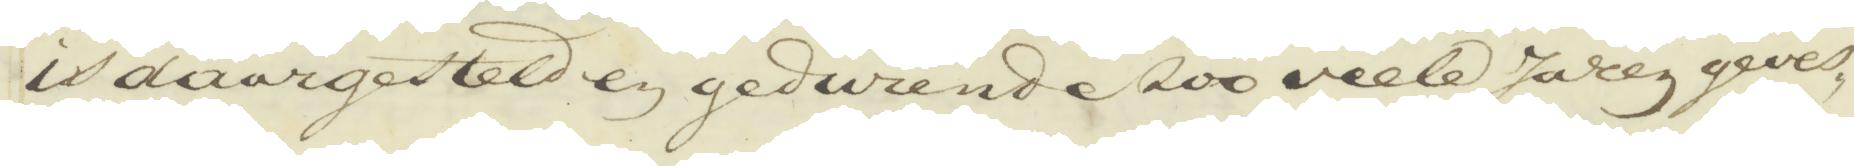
is daargesteld en gedurende zoo veele Jaren geves„
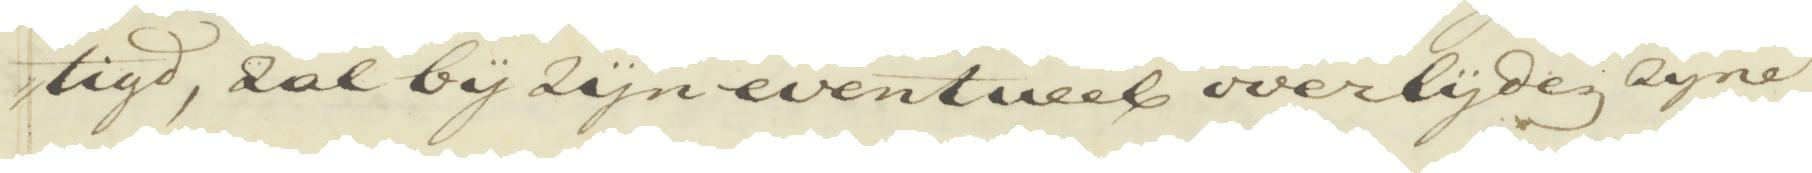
„tigd, zal bij zijn eventueel overlijden zyne
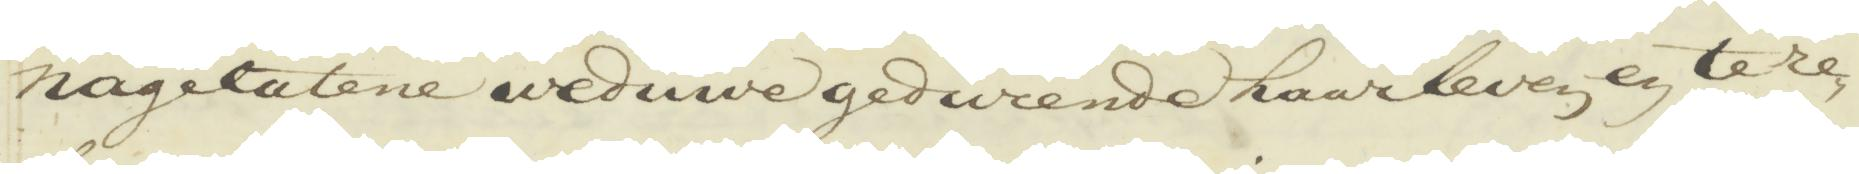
nagelatene weduwe gedurende haar leven en te re„
